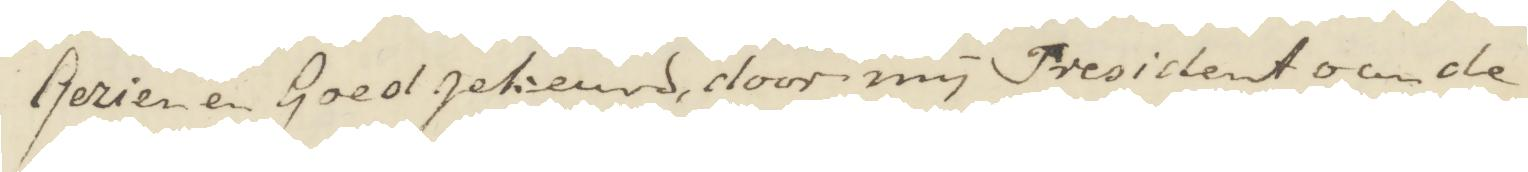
Gezien en Goed gekeurd, door mij President van de
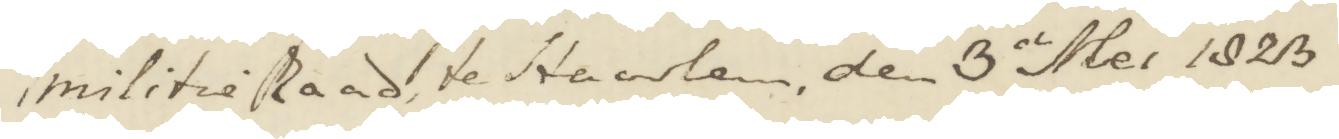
militie raad, te Haarlem, den 3de Mei 1823
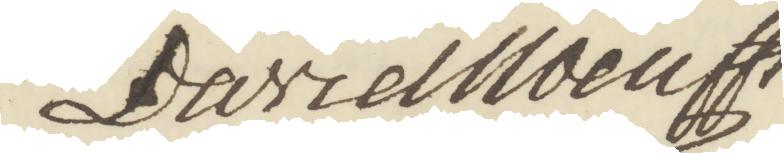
David Hoeuff
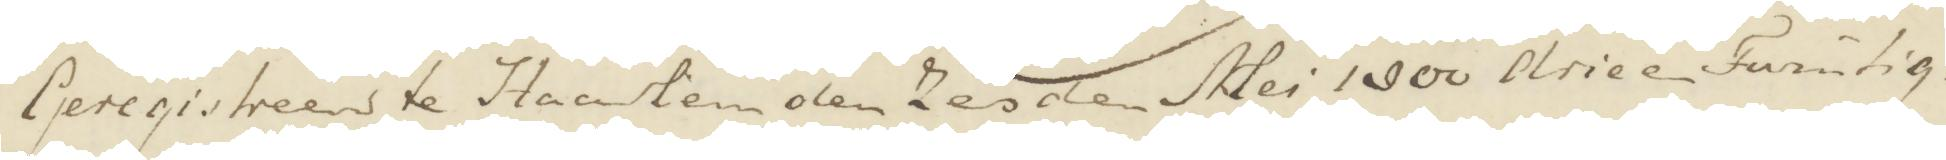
Geregistreerd te Haarlem den Zesden Mei 1800 drie en Twintig
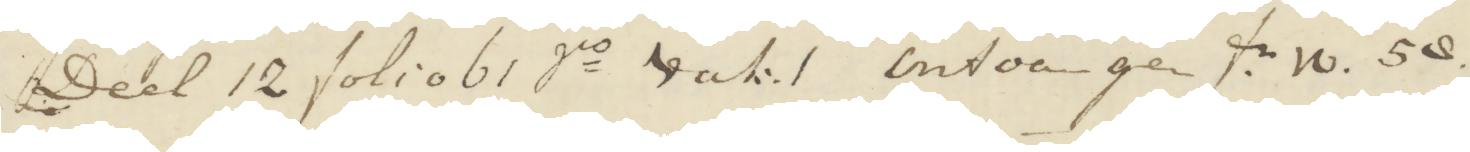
Deel 12 folio 61 V=o Vak: 1 ontvangen ƒ 10. 58
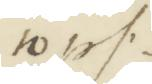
10 pC.
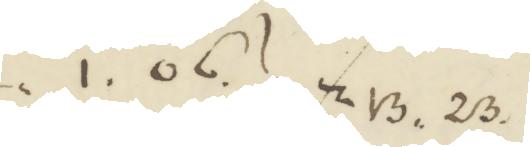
„ 1. 06. ƒ13„ 23.
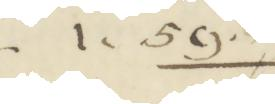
„1 „ 59.
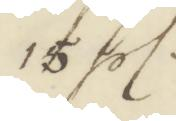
15 pC
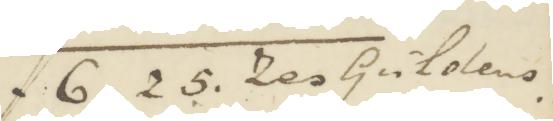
ƒ 6„ 25. zes Guldens
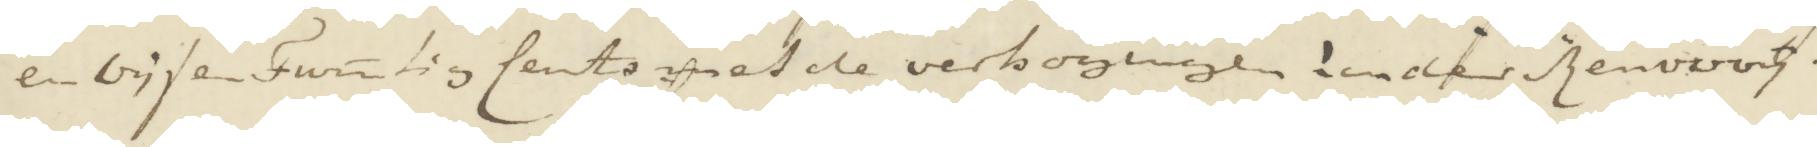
en vijfen Twintig Cents met de verhogingen in de Renvooij
